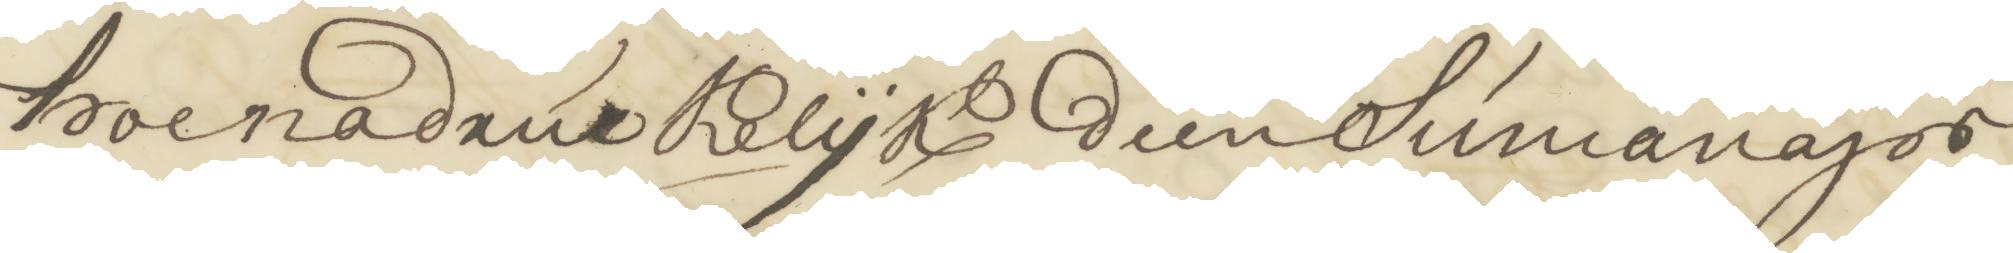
hoe nadruckelijk dien Sumanaps
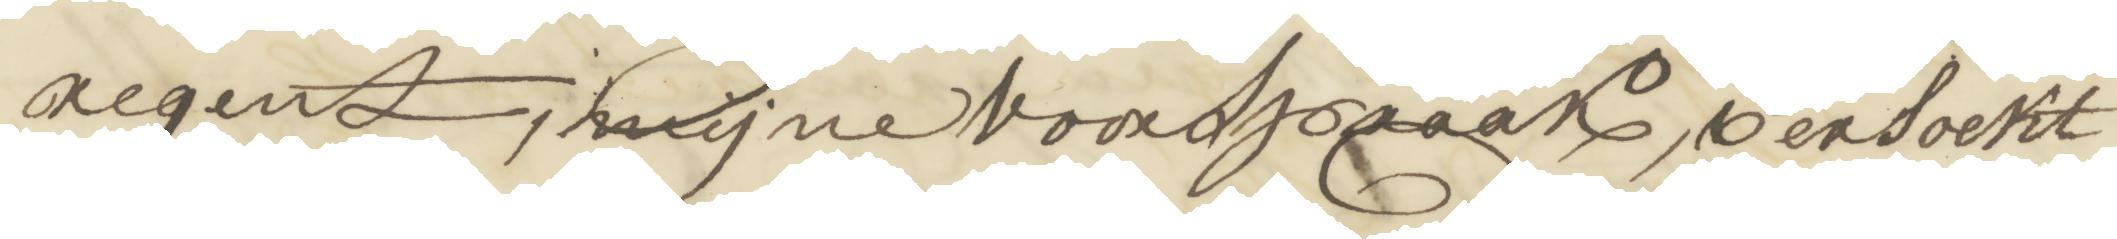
regent, mijne voorspraak, versoekt
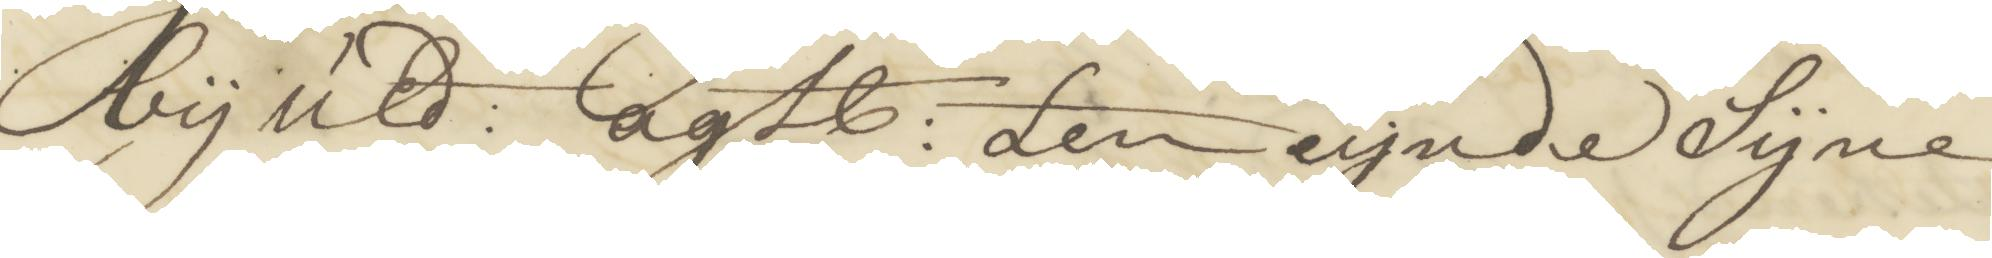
bij uEd: agtb: ten eijnde sijne
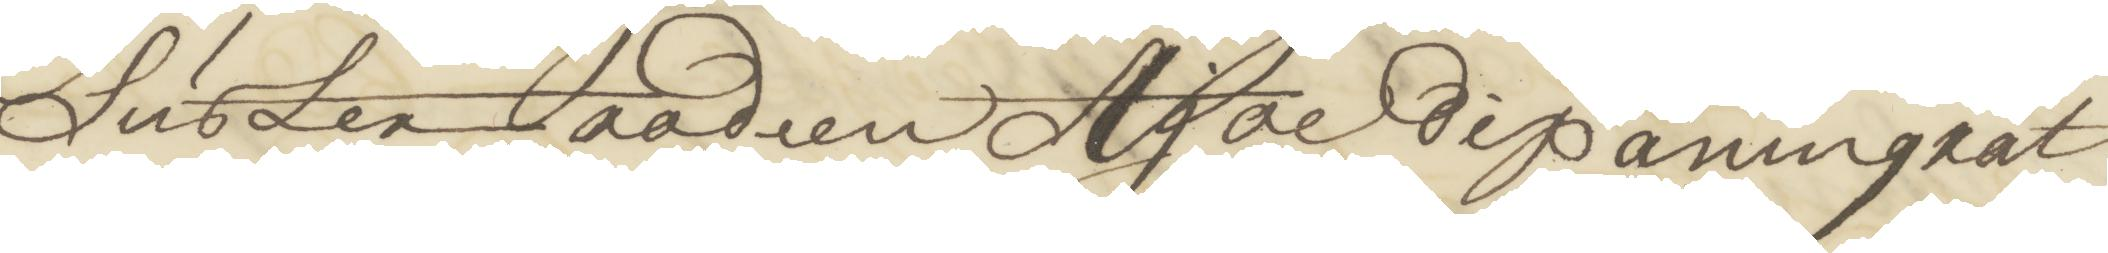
suster aadien Ajoe dipaningrat
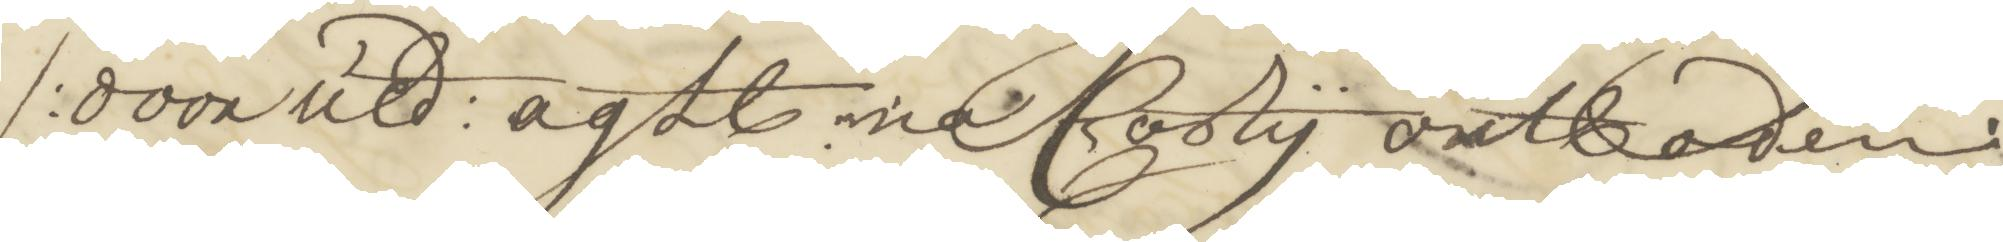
/:door uEd: agtb: na Costij ontboden)
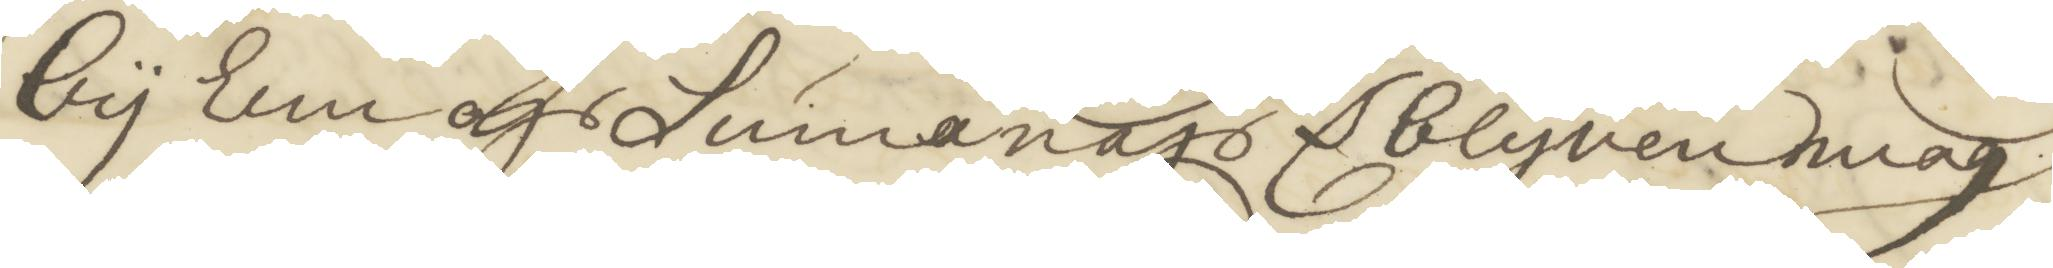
bij hem op sumanap verblijven mag
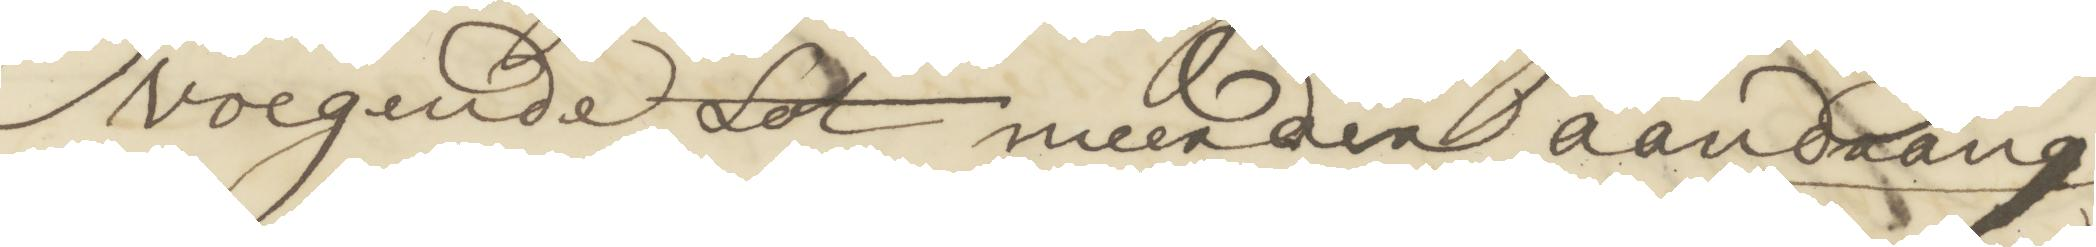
voegende tot meerder aandrang
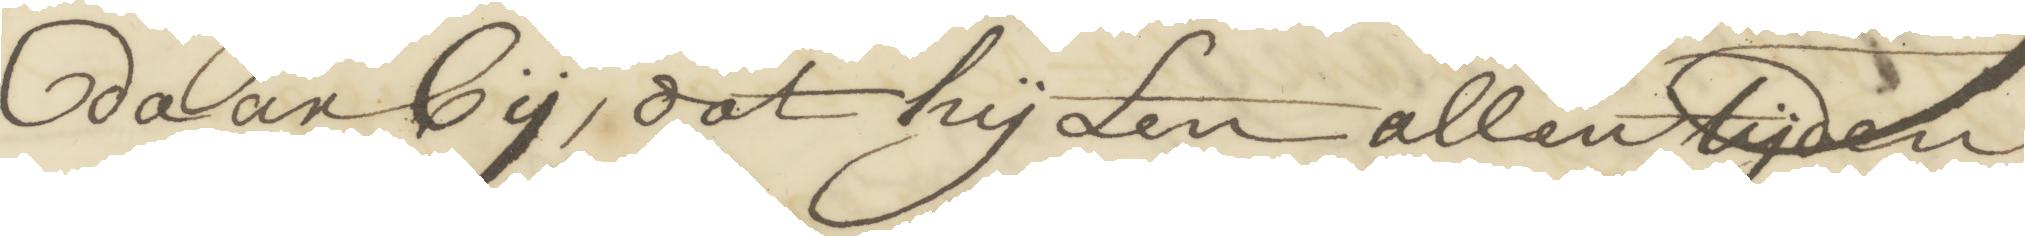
daarbij, dat hij ten allen tijden
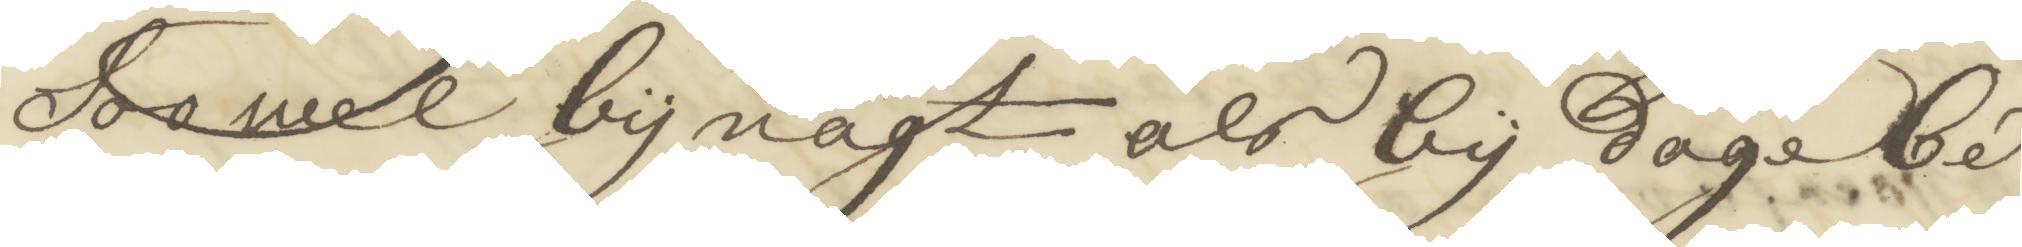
soo wel bij nagt als bij dage be
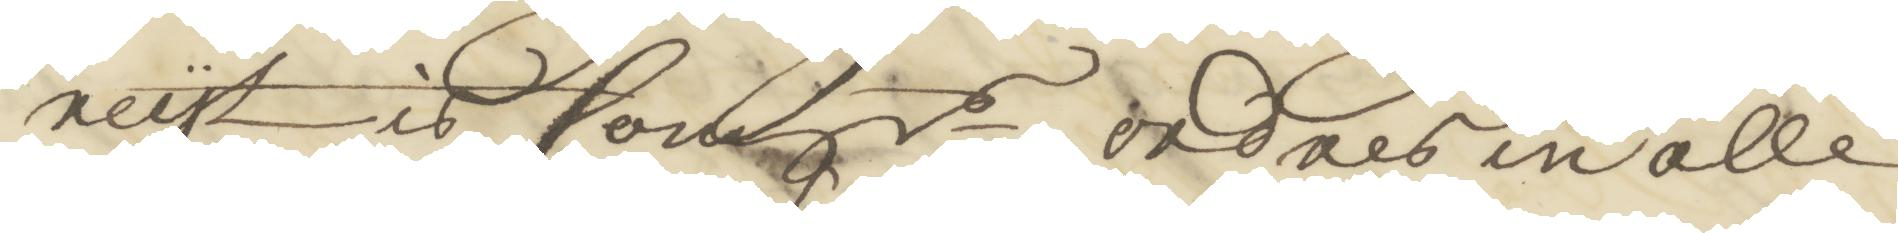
reijt is Comp=s ordres in alle
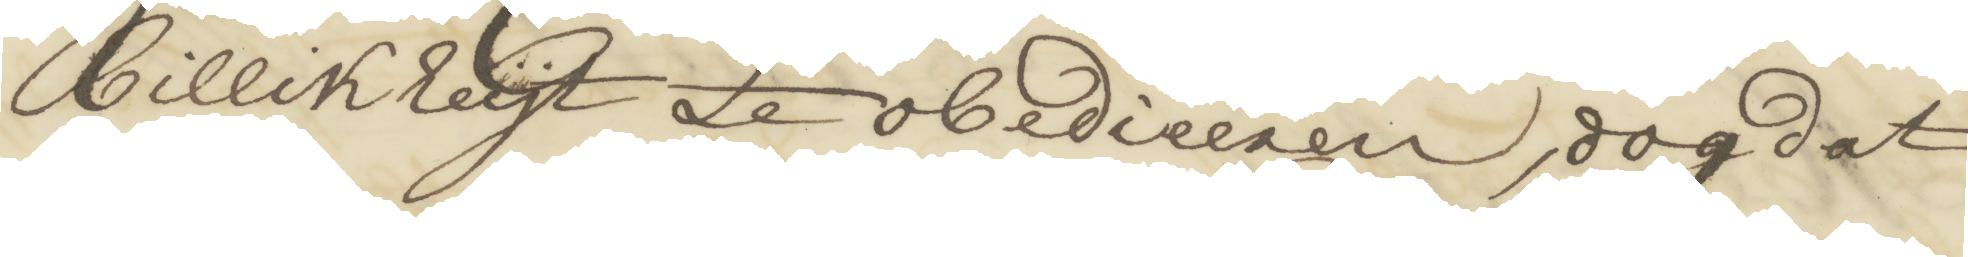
billikheijt te obedieeren, dog dat
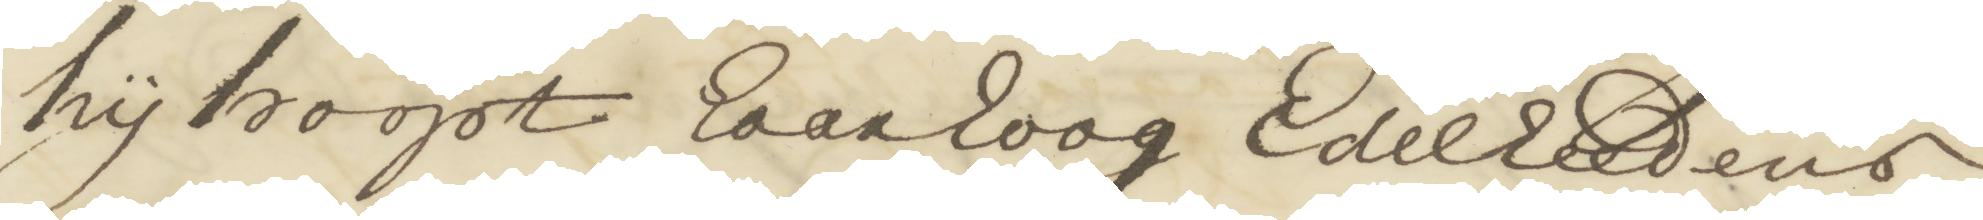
hij hoopt haar hoog Edelheedens
